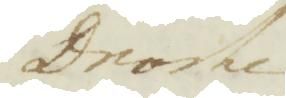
E Droste
